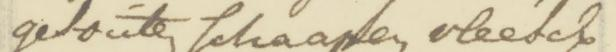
gesouten schaapen vleesch
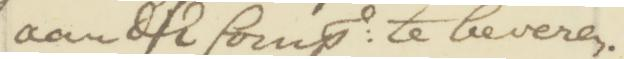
aan dE Comp:e te leeveren.
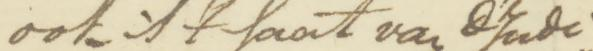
ook is 't saat van d'Jndi„
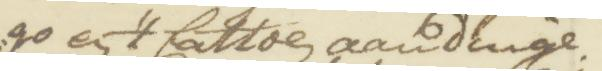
„go en ’t Cattoen aan d'inge:
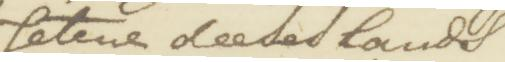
setene deeses lands
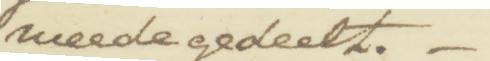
meede gedeelt. —
